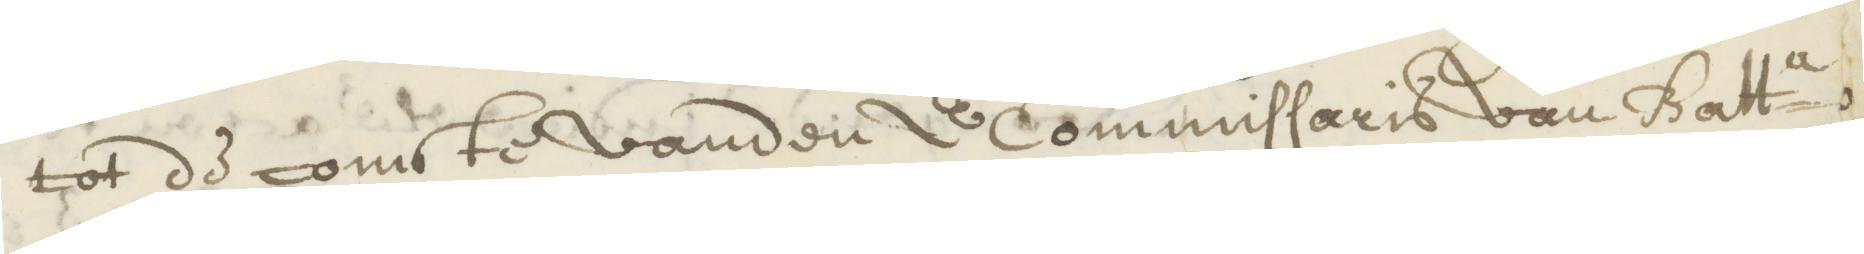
tot de comste vanden E Commissaris van Batt=a
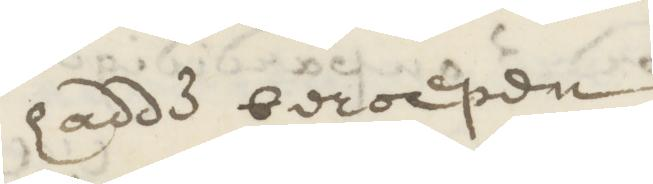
hadde beroepen
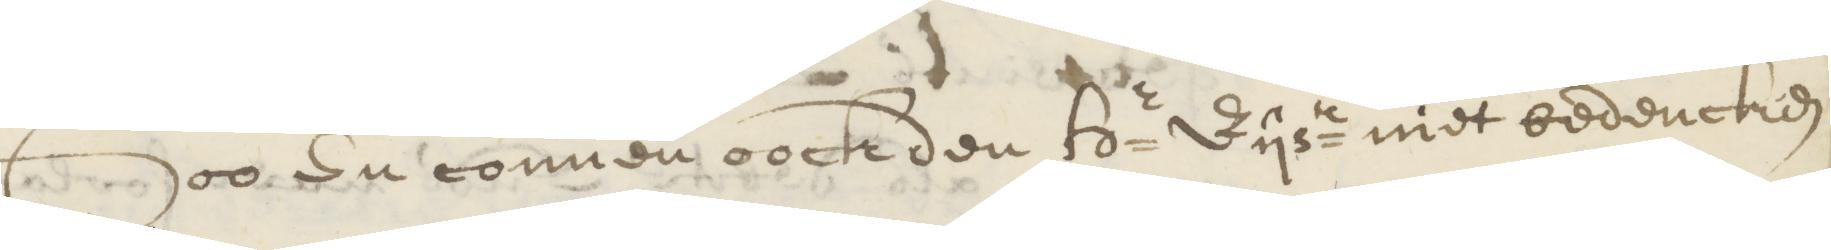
Soo en connen oock den h=r Eijs=r niet bedencken
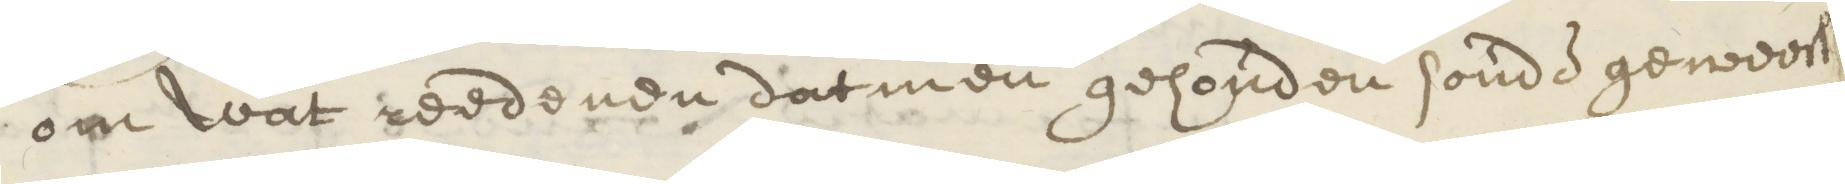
om wat reedenen dat men gehouden soude geweest
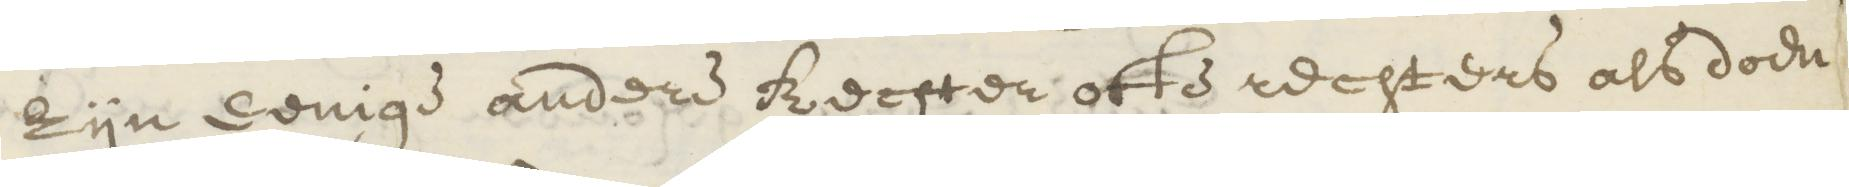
zijn eenige andere Rechter ofte rechters als doen
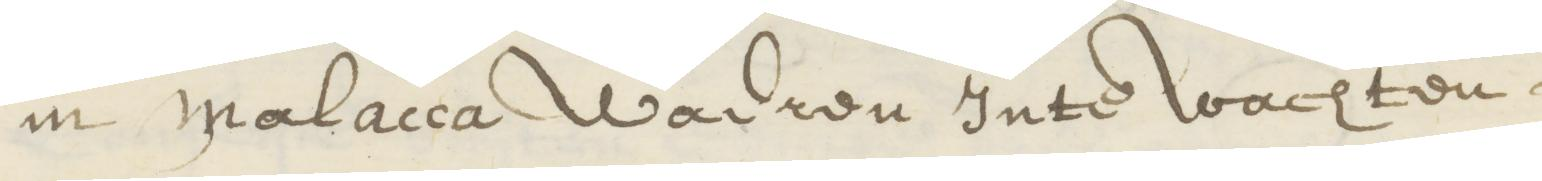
in malacca waeren Inte wachten
